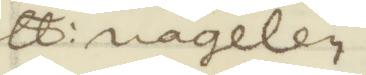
lb: nagelen
